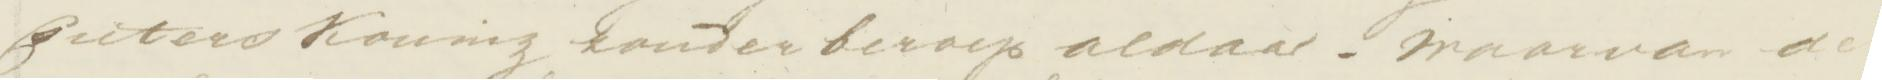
Pieters Koning zonder beroep aldaar, waarvan de
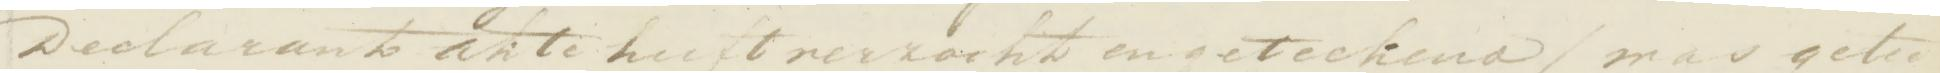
Declarant akte heeft verzocht en geteekend / was getee
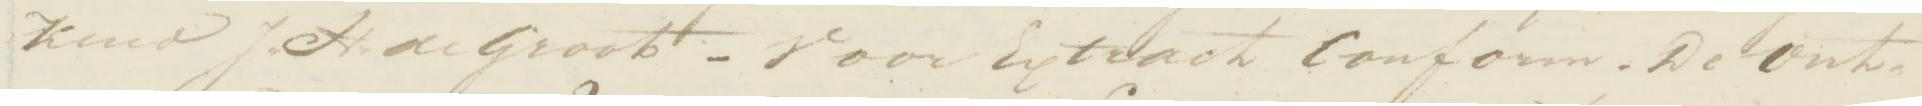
kend J„ H„ de Groot - Voor Extract Conform. De ont„
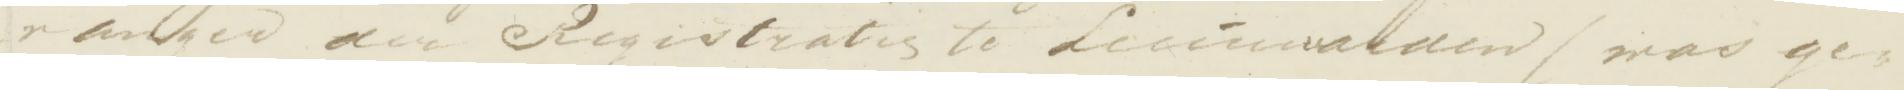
vanger der Registratie te Leeuwarden / was ge„
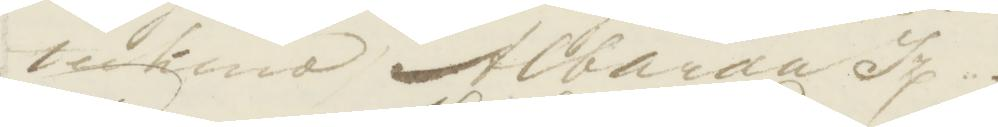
teekend Albarda Iz..
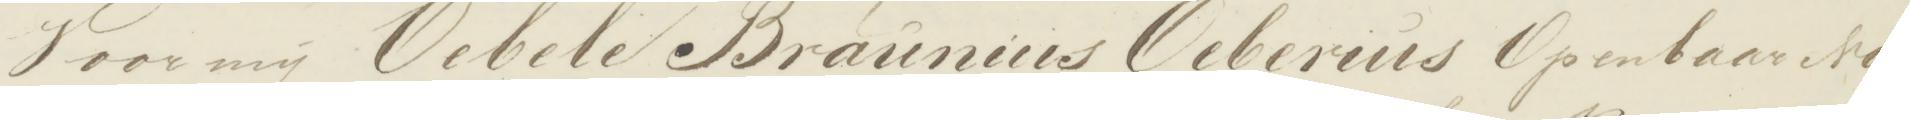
Voor mij Oebele Braunius Oeberius Openbaar No
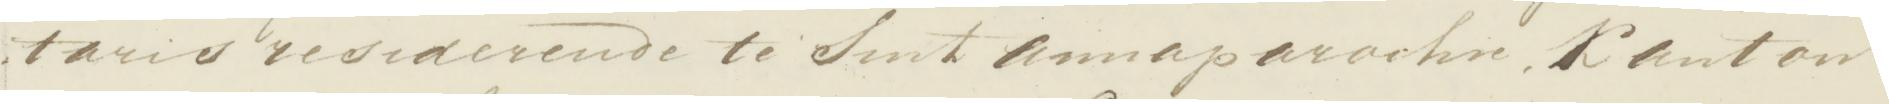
taris residerende te Sint Annaparochie, Kanton
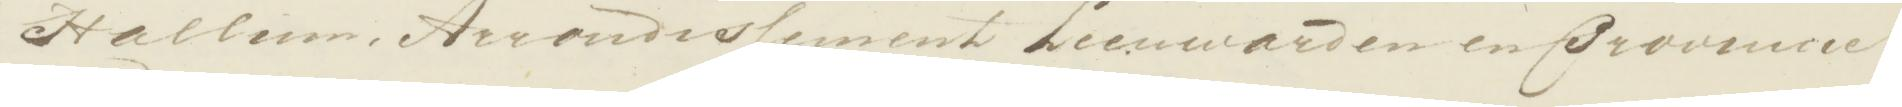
Hallum, Arrondissement Leeuwarden in Provincie
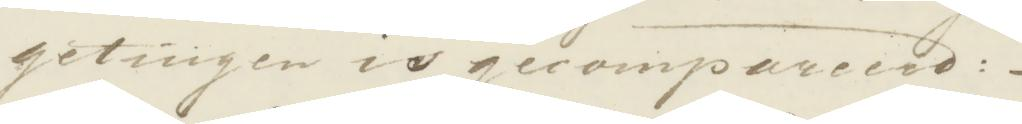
getuigen is gecompareerd:
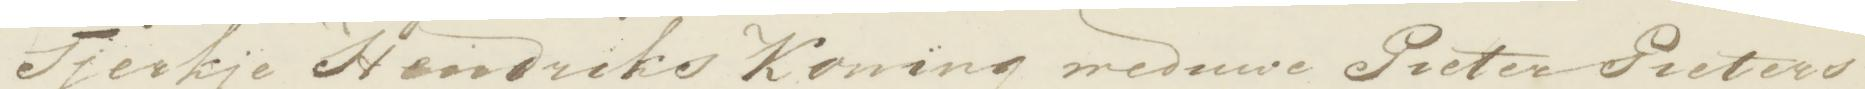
Tjerkje Hendriks Koning weduwe Pieter Pieters
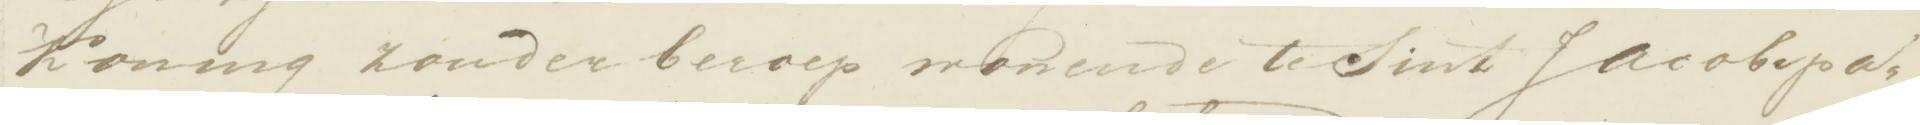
Koning zonder beroep wonende te Sint Jacobspa„
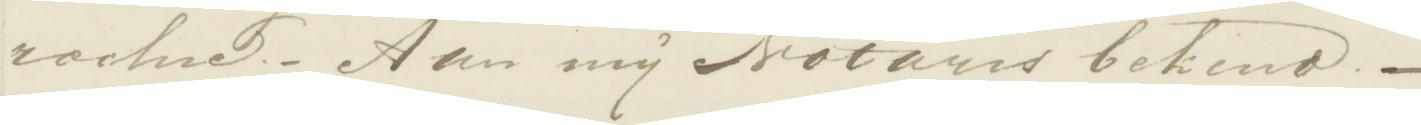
rochie. - Aan mij Notaris bekend.
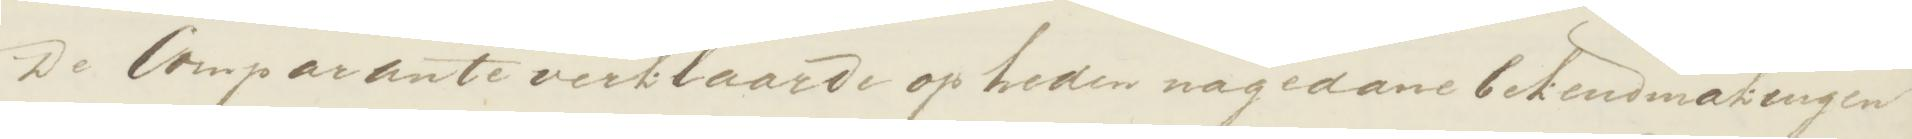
De Comparante verklaarde op heden nagedane bekendmakingen
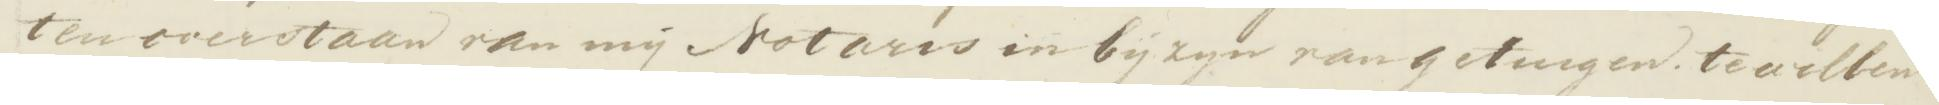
ten overstaan van mij Notaris in bij zijn van getuigen, te willen
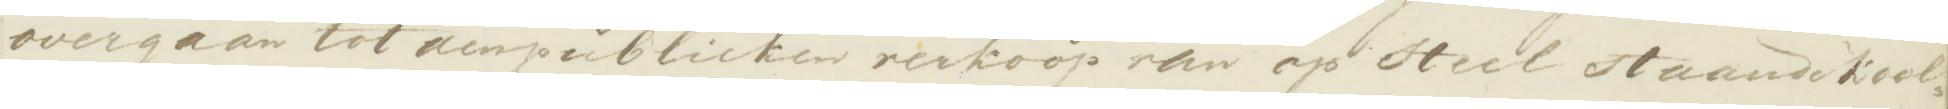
overgaan tot den publieken verkoop van op steel staande Kool
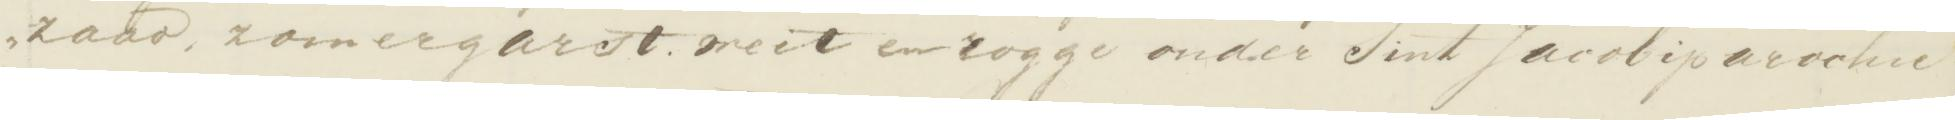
„zaad, zomergarst, weit en rogge onder Sint Jacobiparochie
